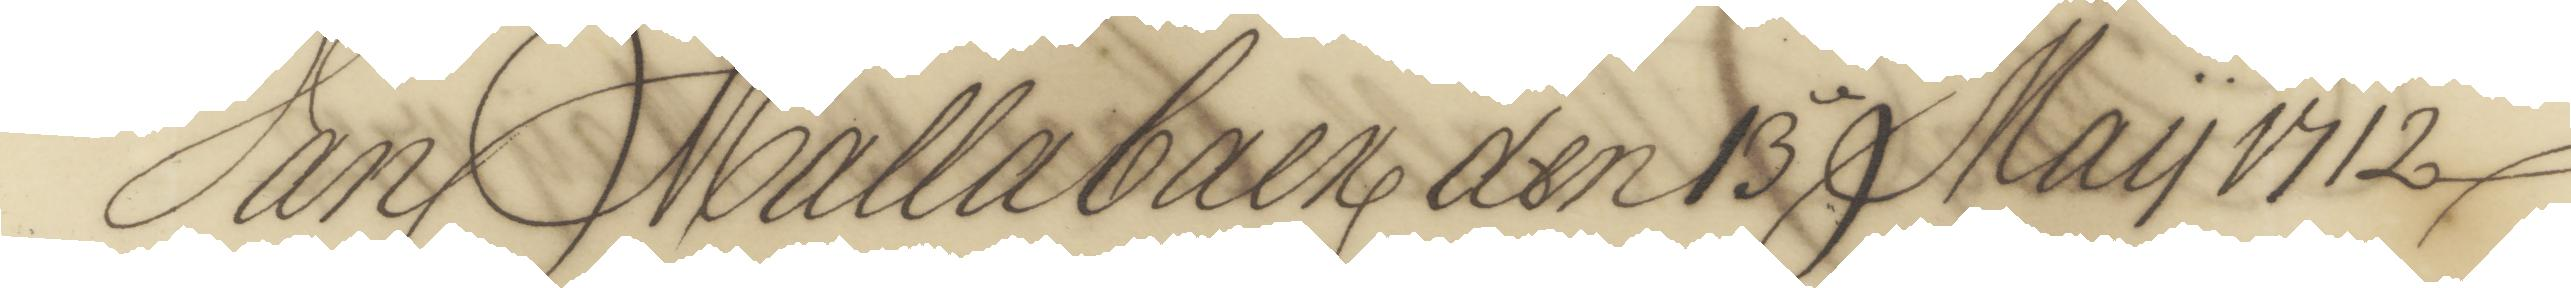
Van Mallabaer den 13e Maij 1712
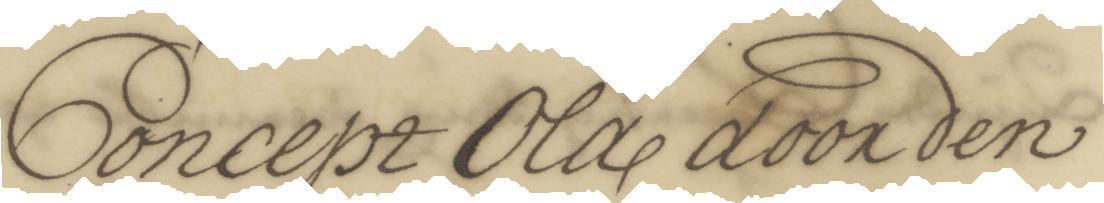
Concept Ola door den
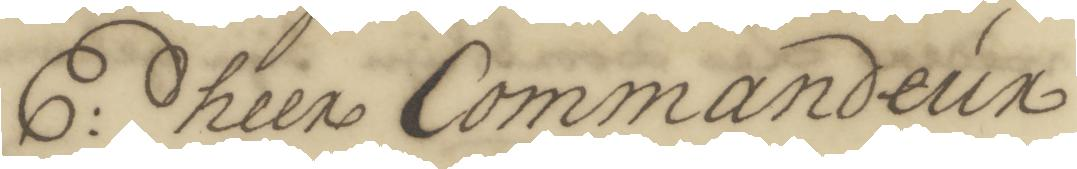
E: heer Commandeur
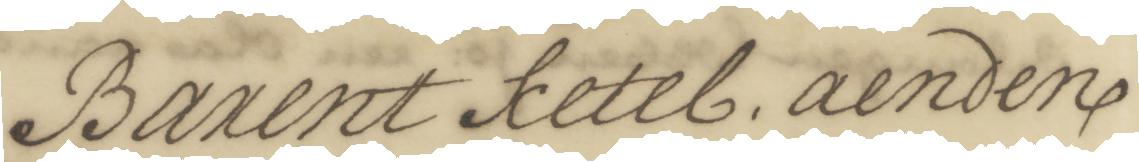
Barent ketel. aenden
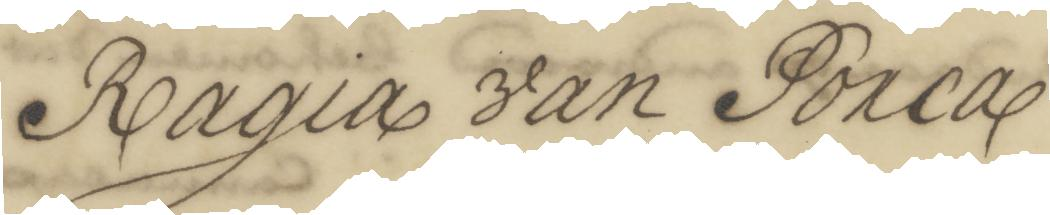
Ragia van Porca
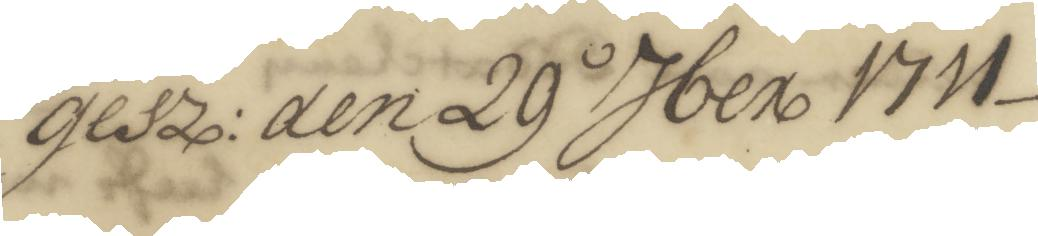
gesz: den 29' 7ber 1711_
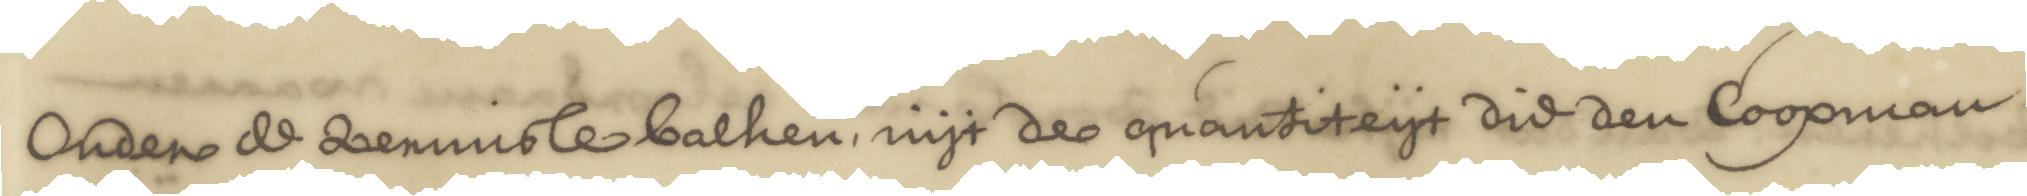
Onder de vermiste balken, uijt de quantiteijt die den Coopman
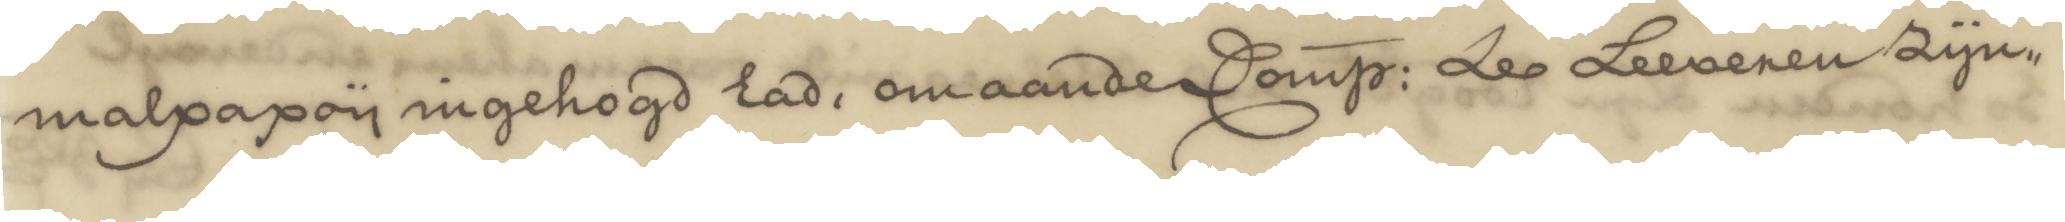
malpapoij ingehogd had, om aande Comp: te leeveren zijn„
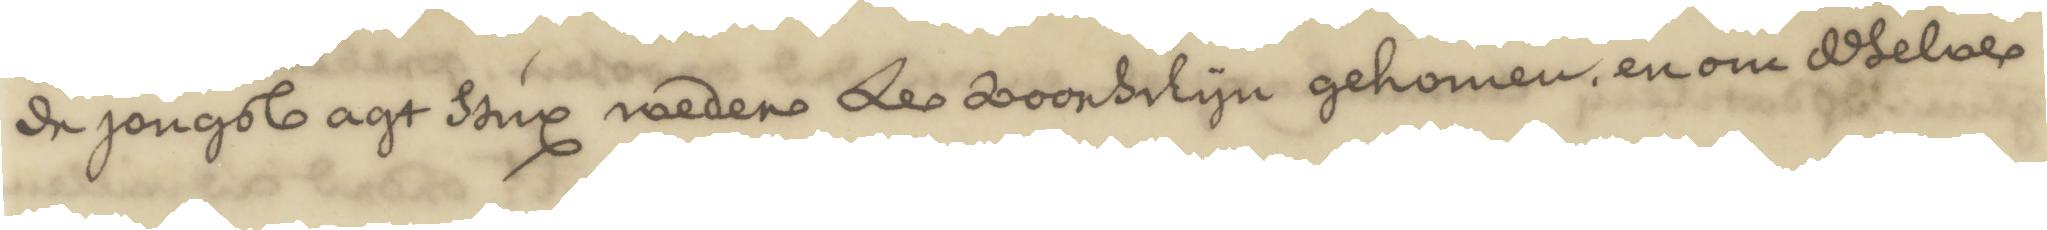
er jongst agt stux weder te voorschijn gekomen, en om deselve
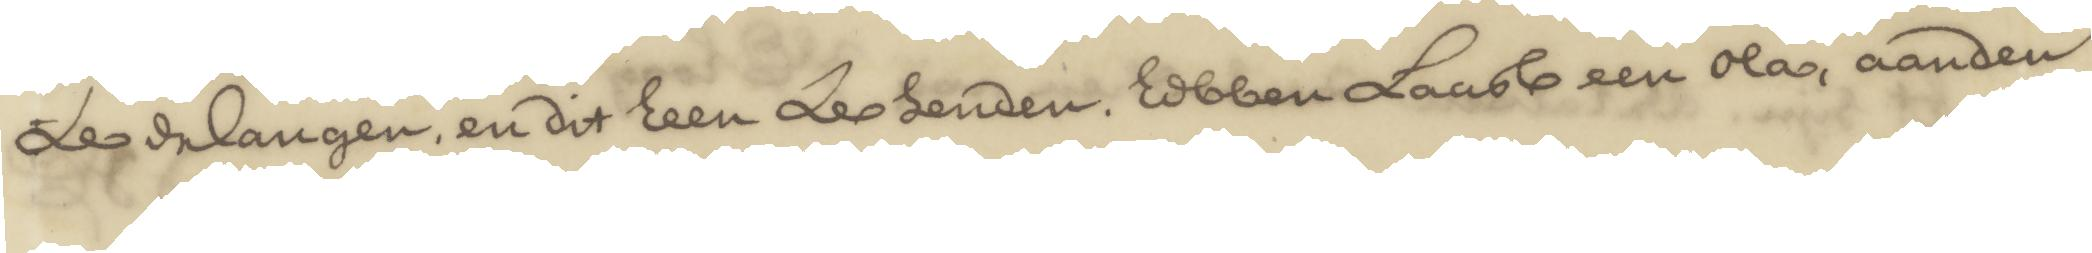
te erlangen, en dit heen te senden. hebben Laast een ola, aanden
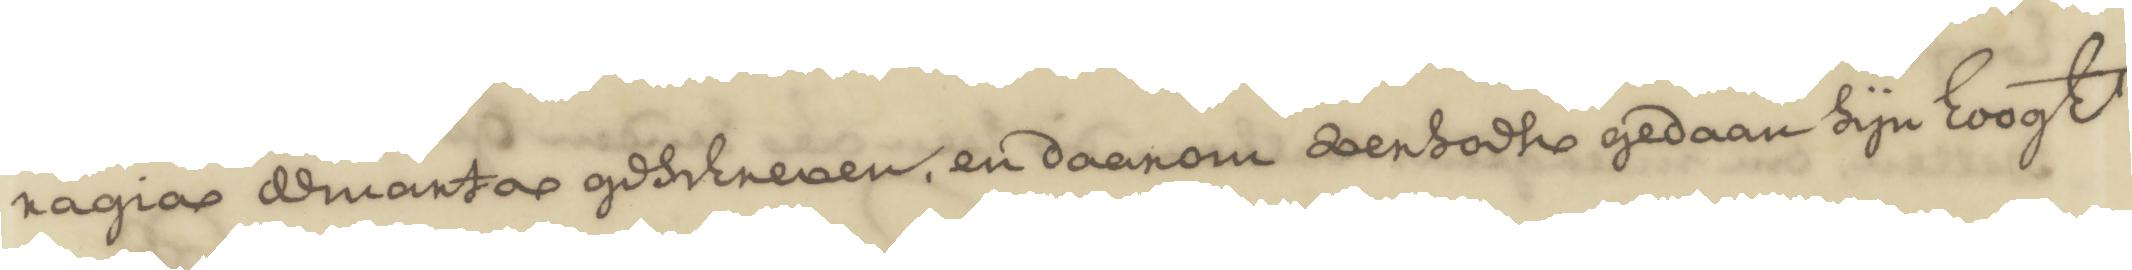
ragia demarta geschreven, en daarom versoek gedaan sijn hooght
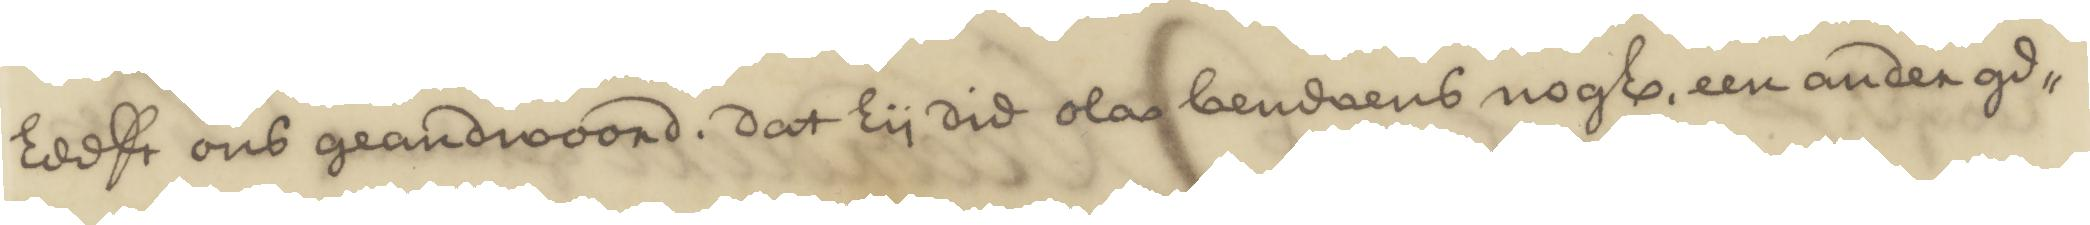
heeft ons geandwoord. dat hij die ola benevens nogh, een ander ge„
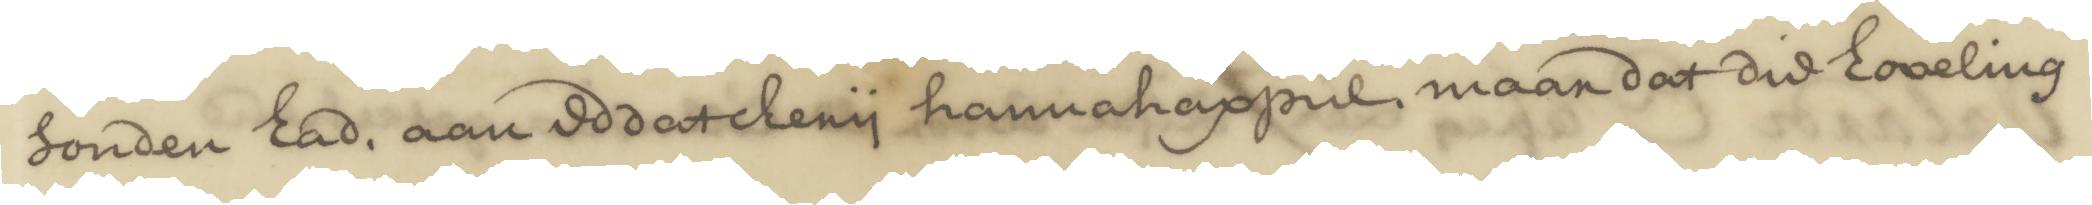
sonden had, aan eddatcherij kannakappul, maar dat die hoveling
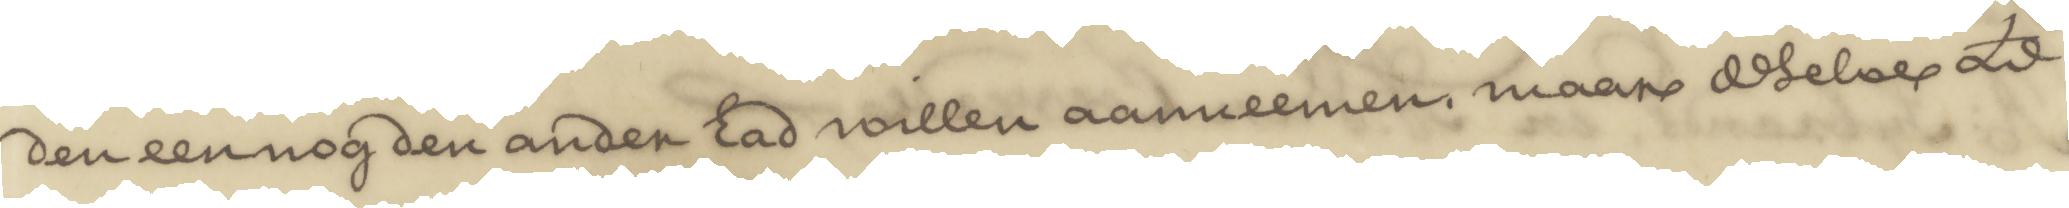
den een nog den ander had willen aanneemen, maar deselve te
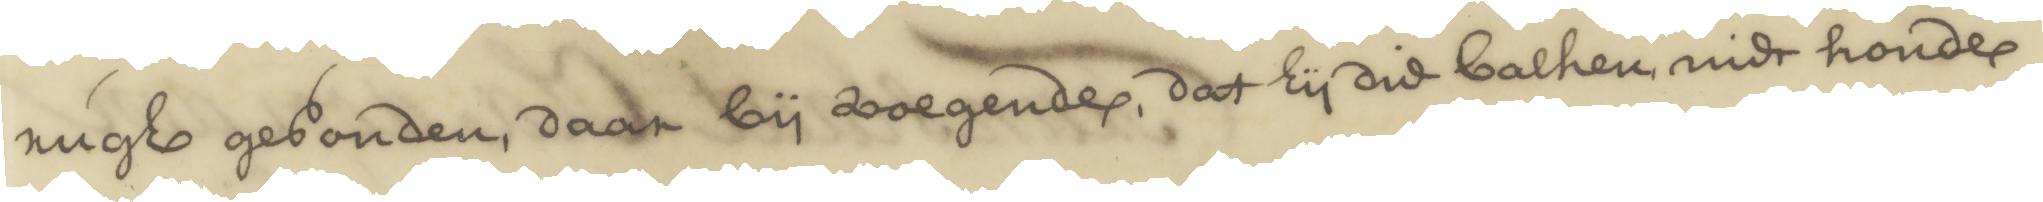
rugh gesonden, daar bij voegende, dat hij die balken, niet konde
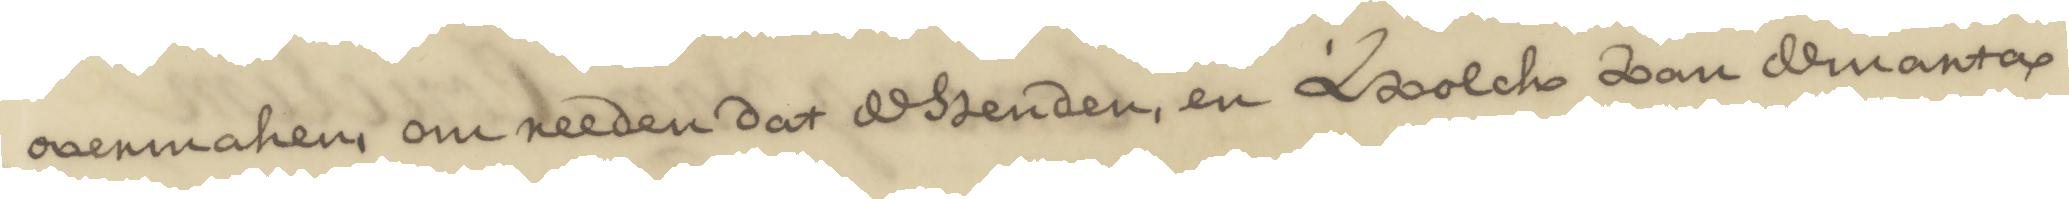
overmaken, om reeden dat destenden, en 'tvolck van demanta
